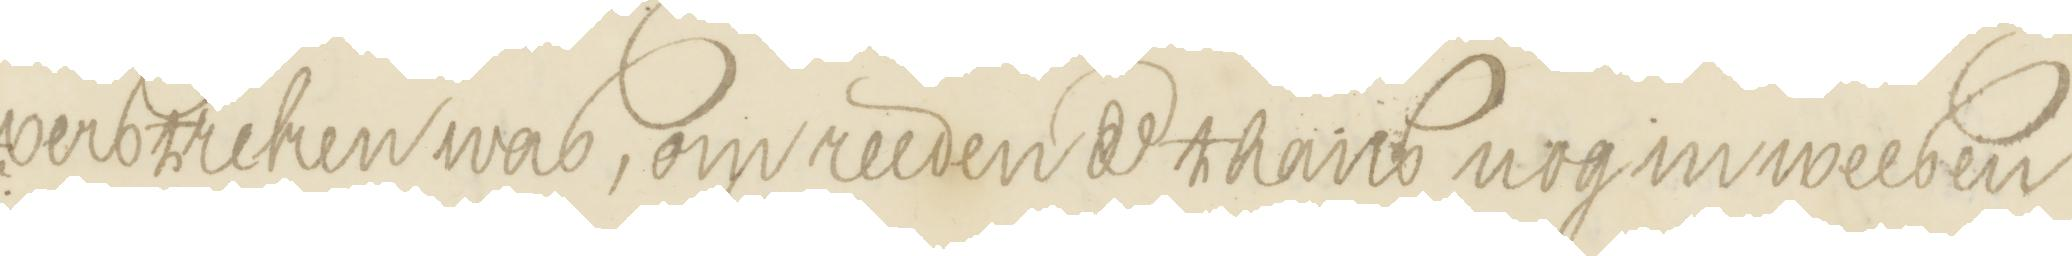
verstreken was, om reeden de thans nog in weesen
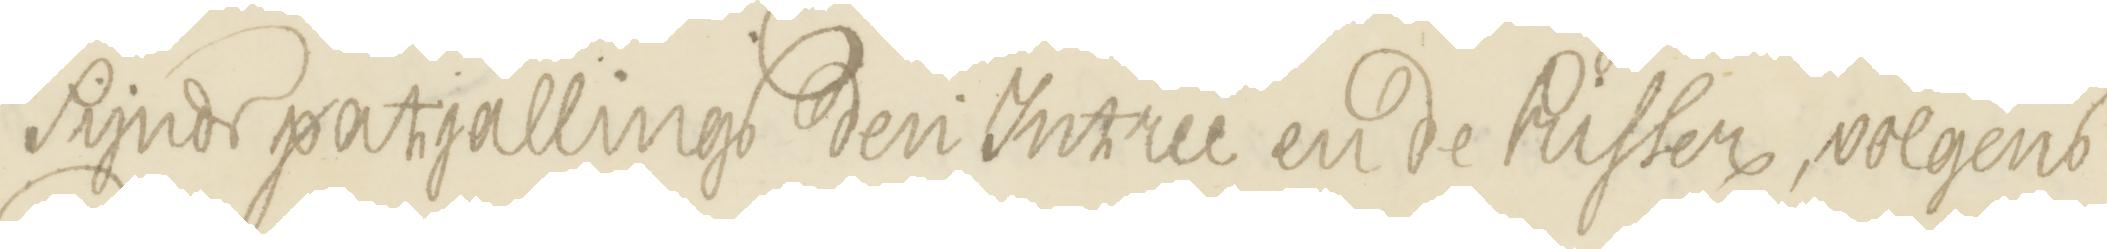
Sijnde patjallings den Intree en de Kisser, volgens
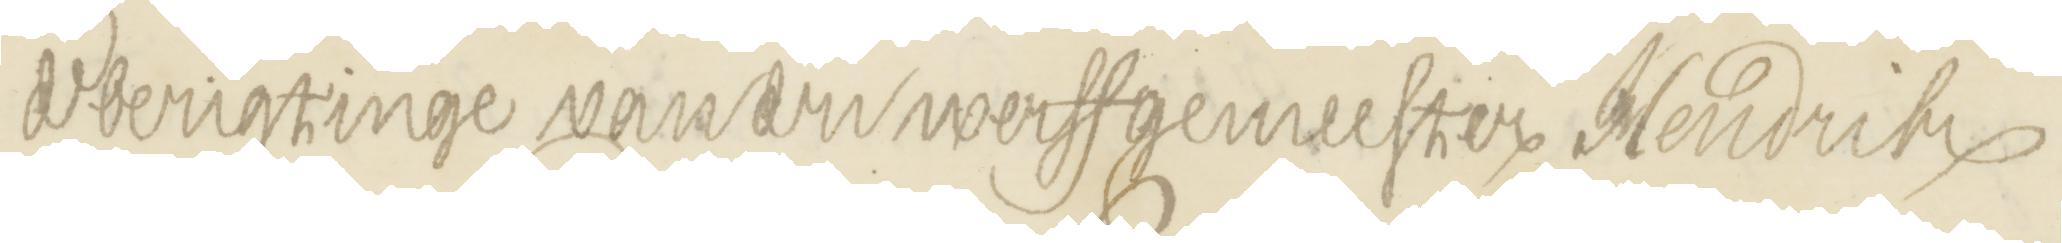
de berigtinge van den werff gemeester Hendrik
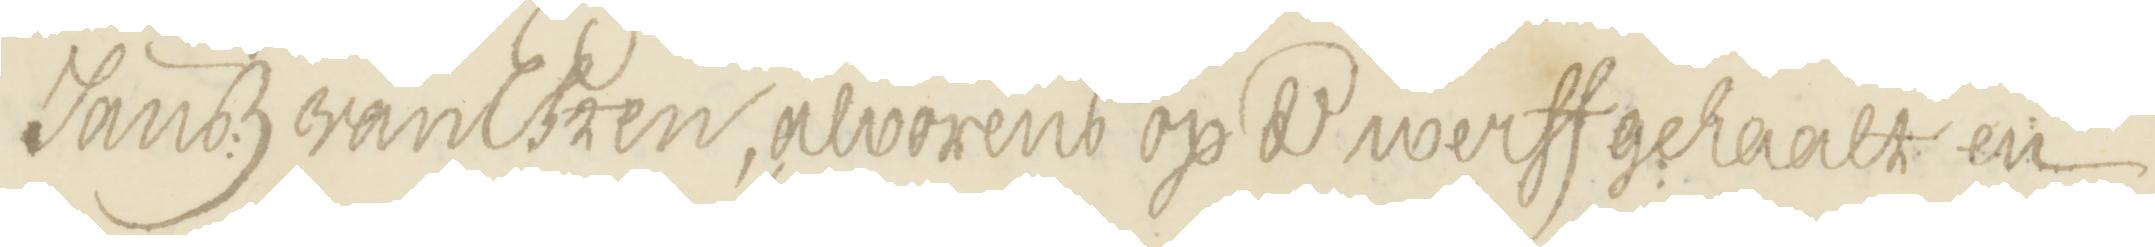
Iansz: van Ehren, alvorens op de werff gehaalt en
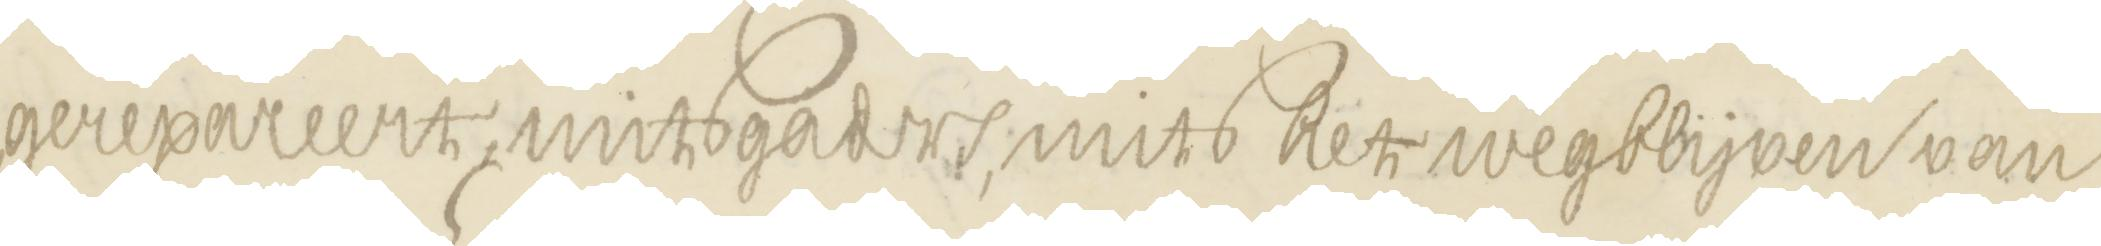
gerepareert, mitsgaders, mits het wegblijven van
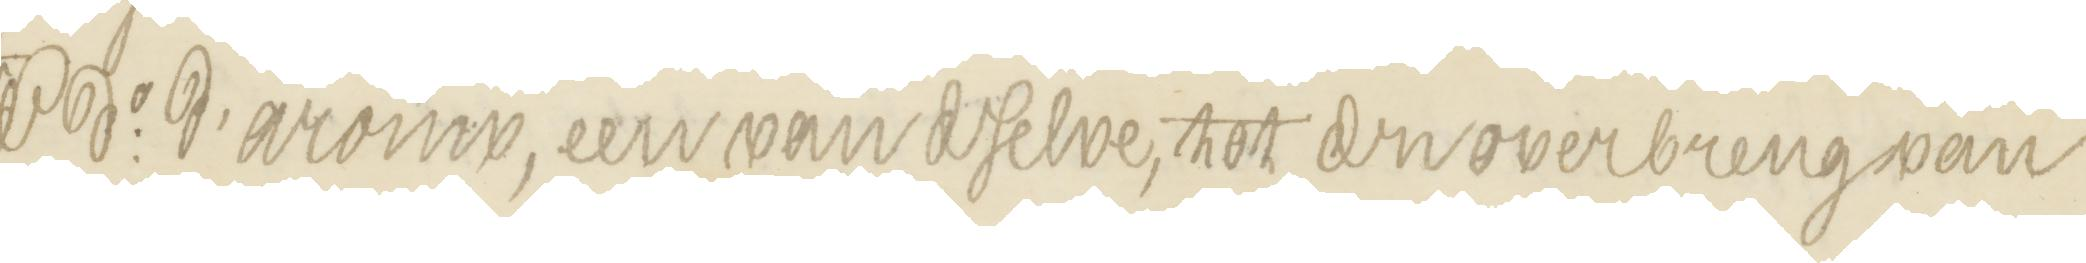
de d:o d'arouw, een van deselve, tot den overbreng van
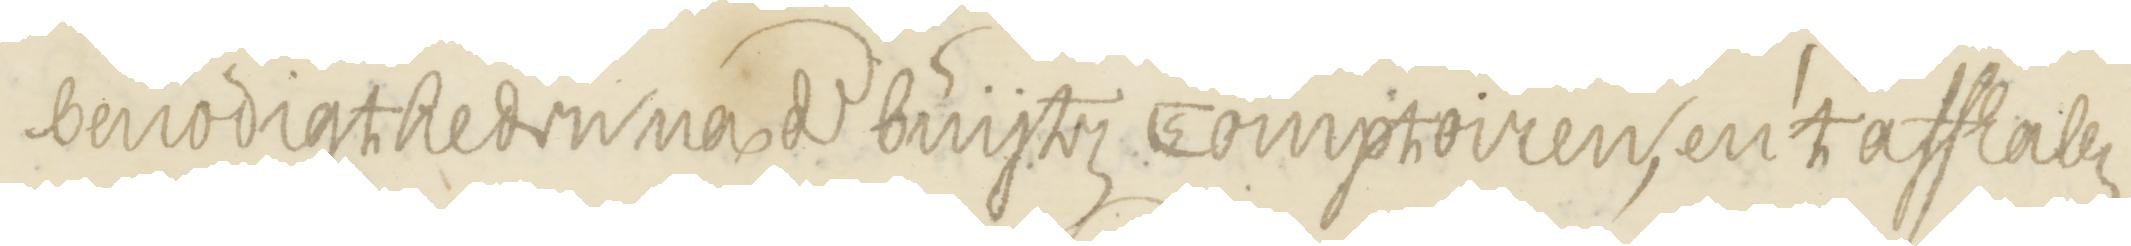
benodigtheden na de buijten comptoiren, en ’t affhalen
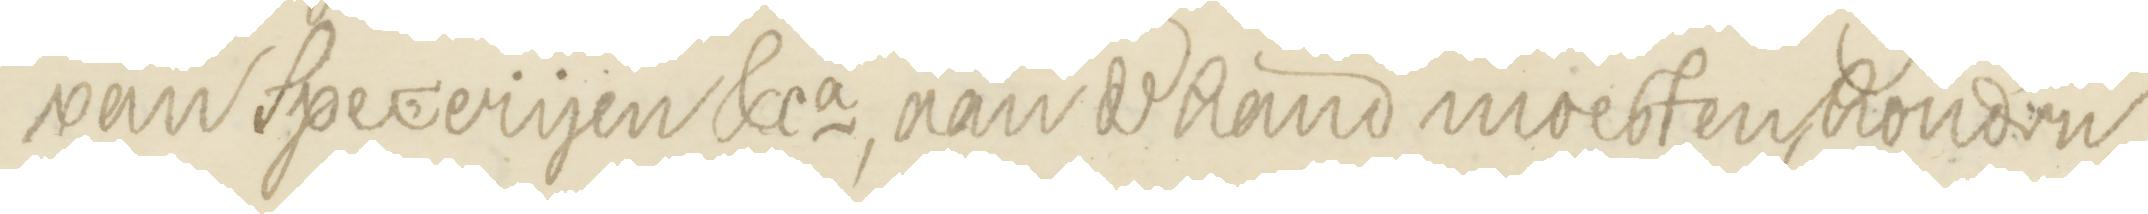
van Specerijen &c=a, aan de hand moesten houden,
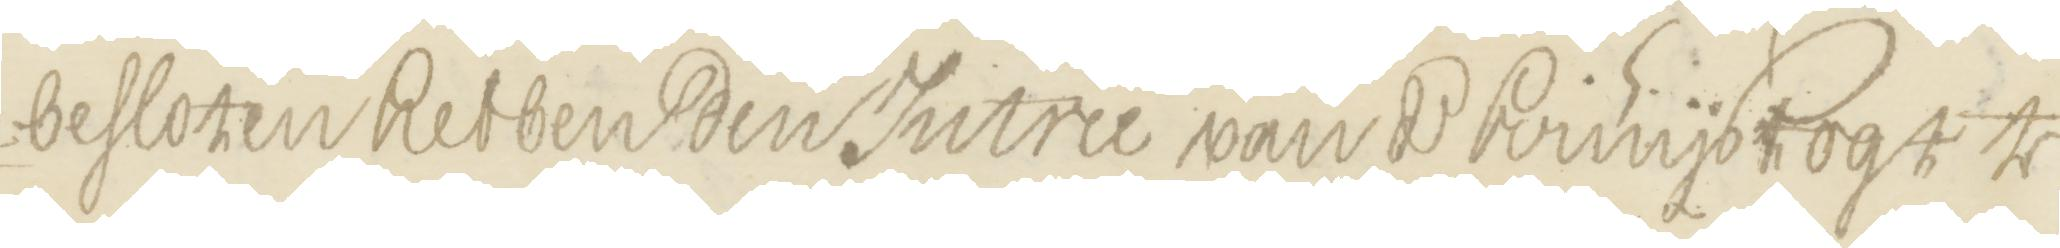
besloten hebben den Intree van de kruijstogt te
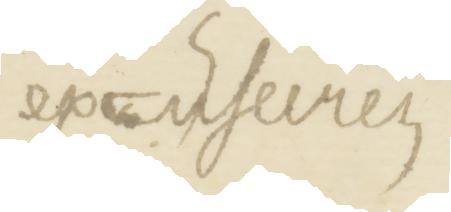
excuseeren
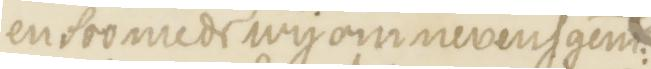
en Soo mede wij om nevens gem:
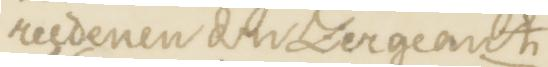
reedenen den Zergeant
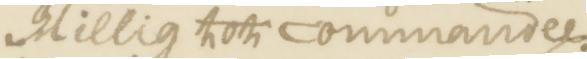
Hillig tot commandee„
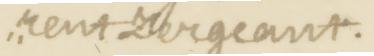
„rent Zergeant.
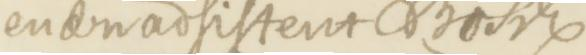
en den adsistent Bosch
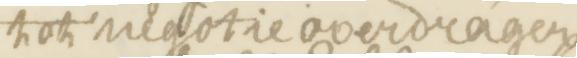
tot negotie overdrager
